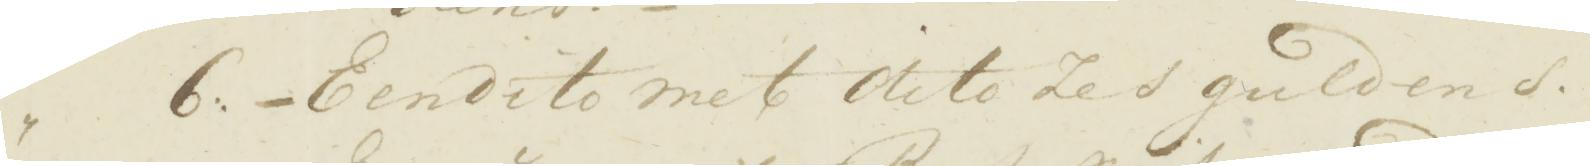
„ 6: — Een dito met dito zes guldens.
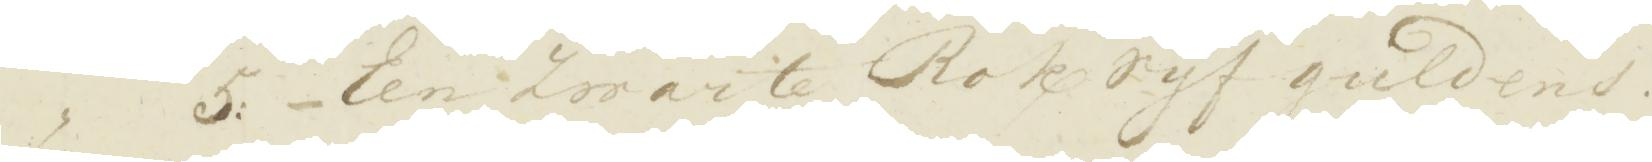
„ 5: — Een zwarte Rok vijf guldens
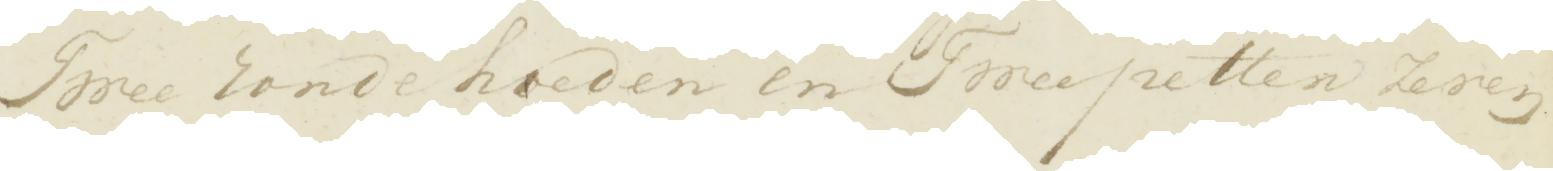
Twee ronde hoeden en Twee petten zeven
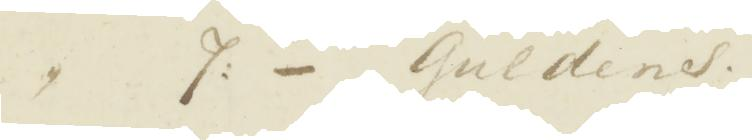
„ 7: — Guldens.
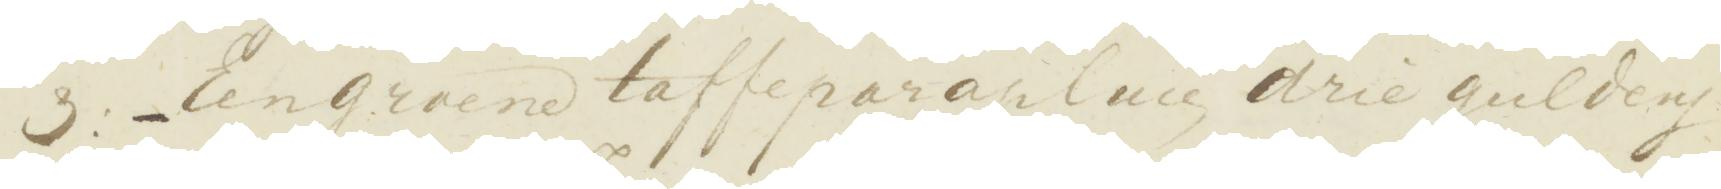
3: — Een groene taffeparapluie, drie guldens
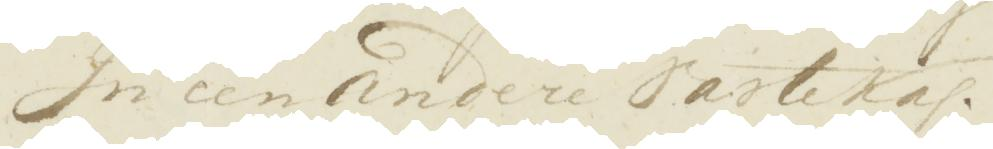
In een andere Vaste kas.
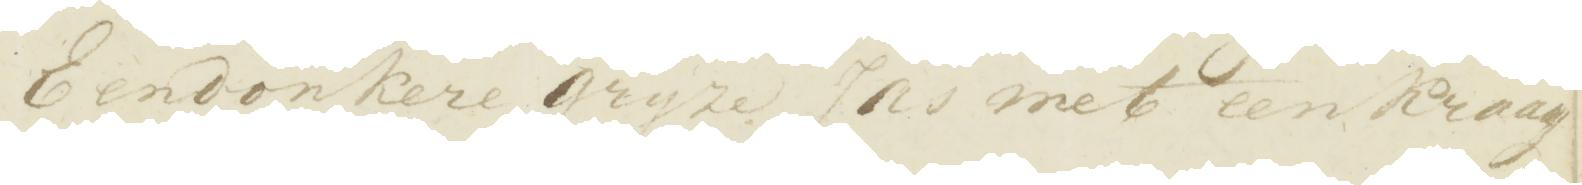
Een donkere gryze Jas met een Kraag
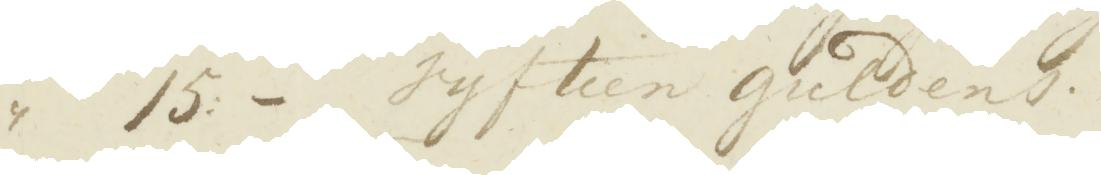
„ 15: — vyftien guldens.
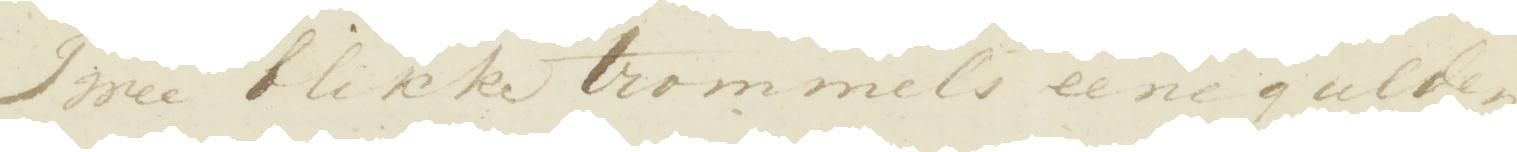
Twee blikke trommels eene gulden
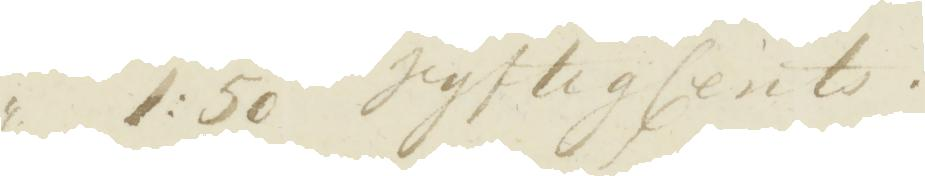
„ 1: 50 Vyftig Cents.
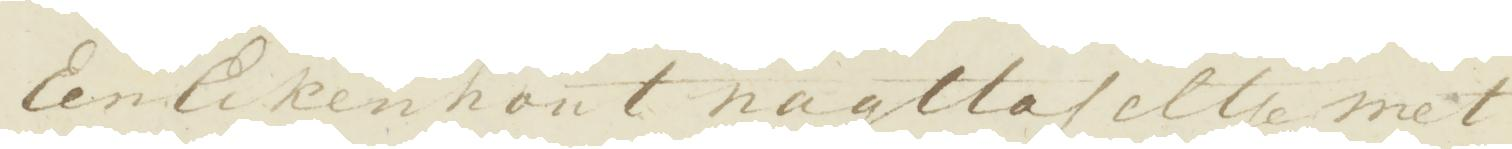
Een Eikenhout nagttafeltje met
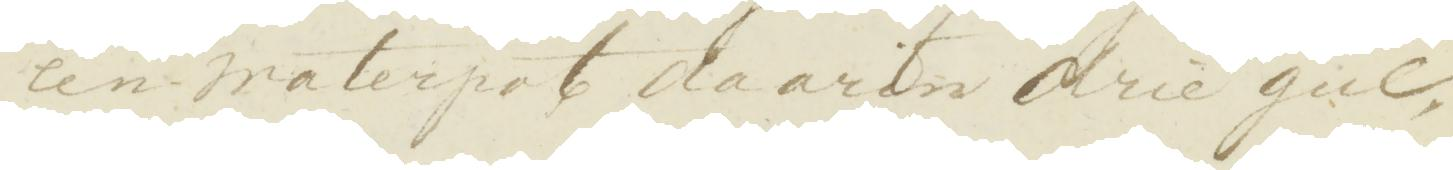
een waterpot daarin drie gul„
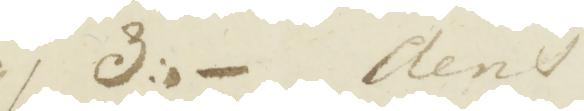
3: — dens
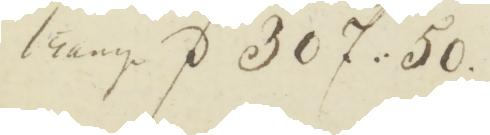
transp. ƒ 307: 50.
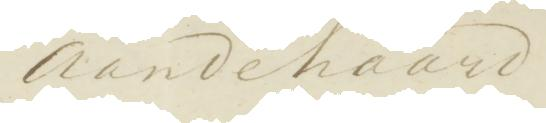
Aan de haard
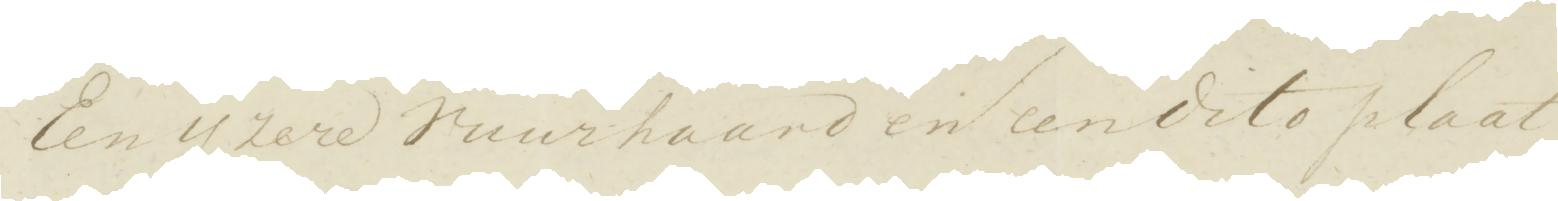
Een ijzere vuurhaard en een dito plaat
